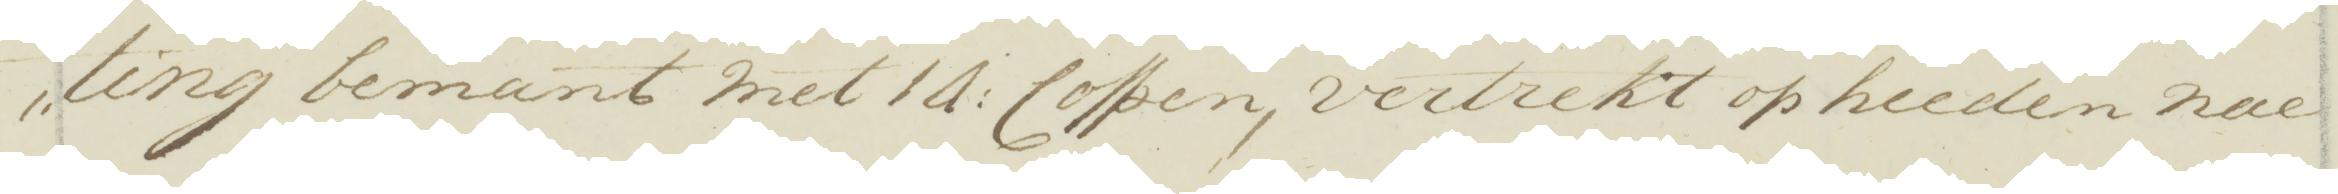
„ting bemant met 14: coppen, vertrekt op heeden nae
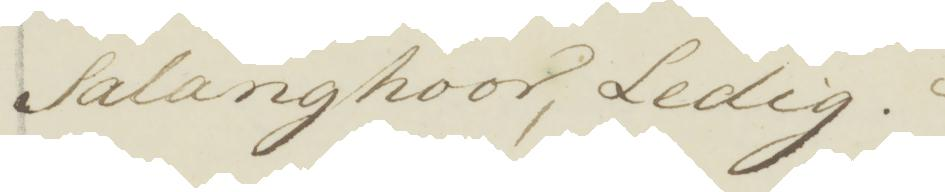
Salanghoor, ledig.
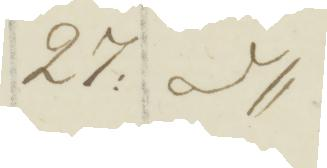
27: d„o
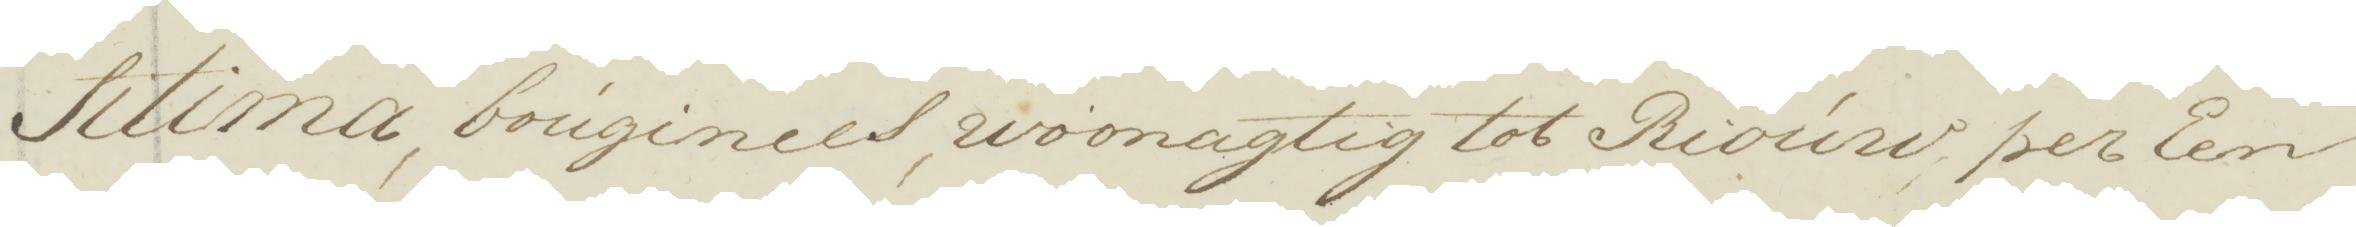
Sitima bouginees, woonagtig tot Riouw, per Een
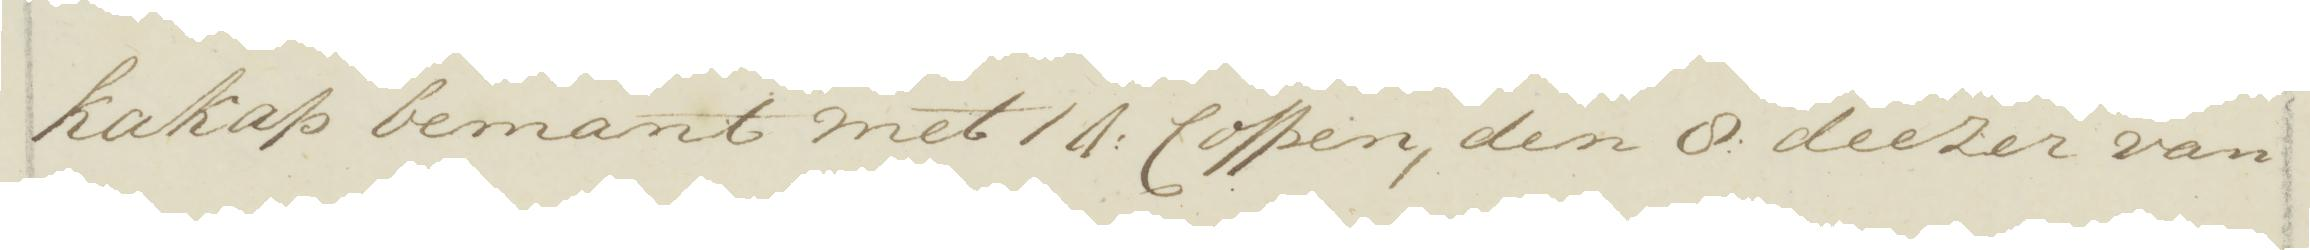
kakap bemant met 14: coppen, den 8: deezer van
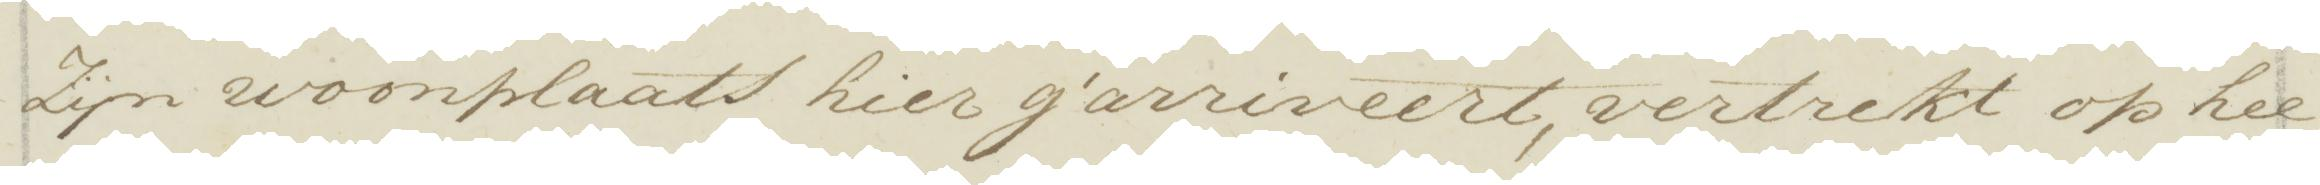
zijn woonplaats hier g'arriveert, vertrekt op hee
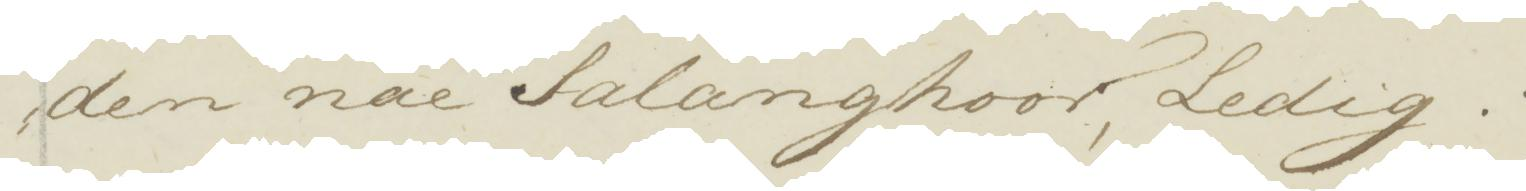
„den nae Salanghoor Ledig.
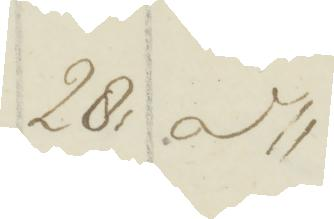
28. d„o
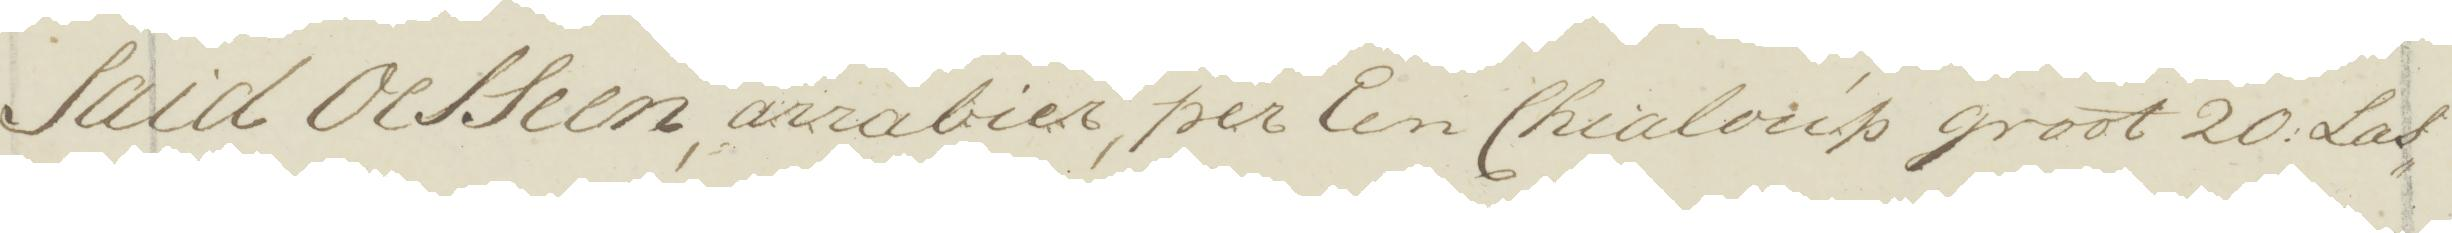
Said Oesseen arrabier, per Een chialoup groot 20: Las„
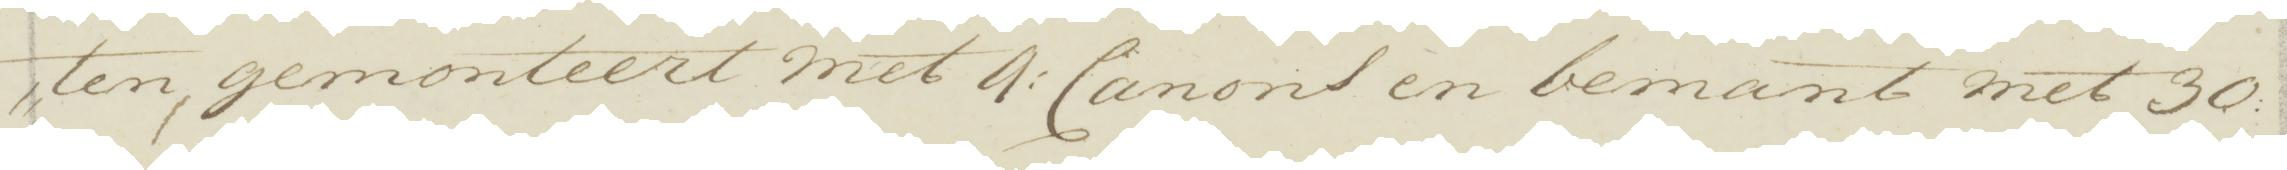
„ten, gemonteert met 4: canons en bemant met 30:
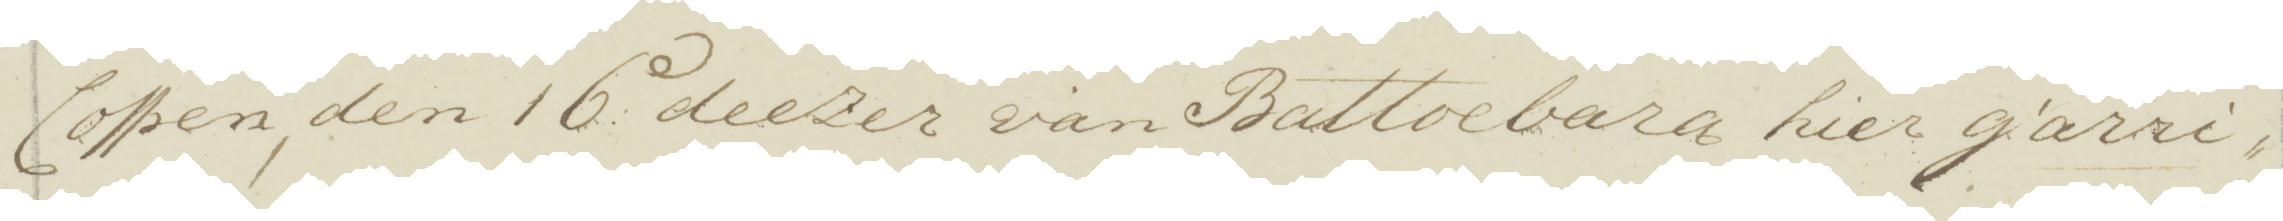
coppen, den 16: deezer van Battoebara hier g'arri„
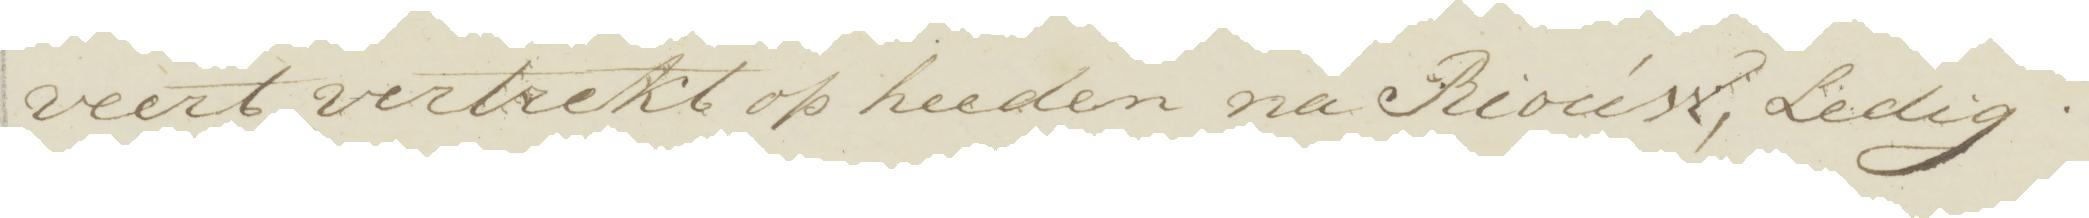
veert vertrekt op heeden na Riouw, Ledig:
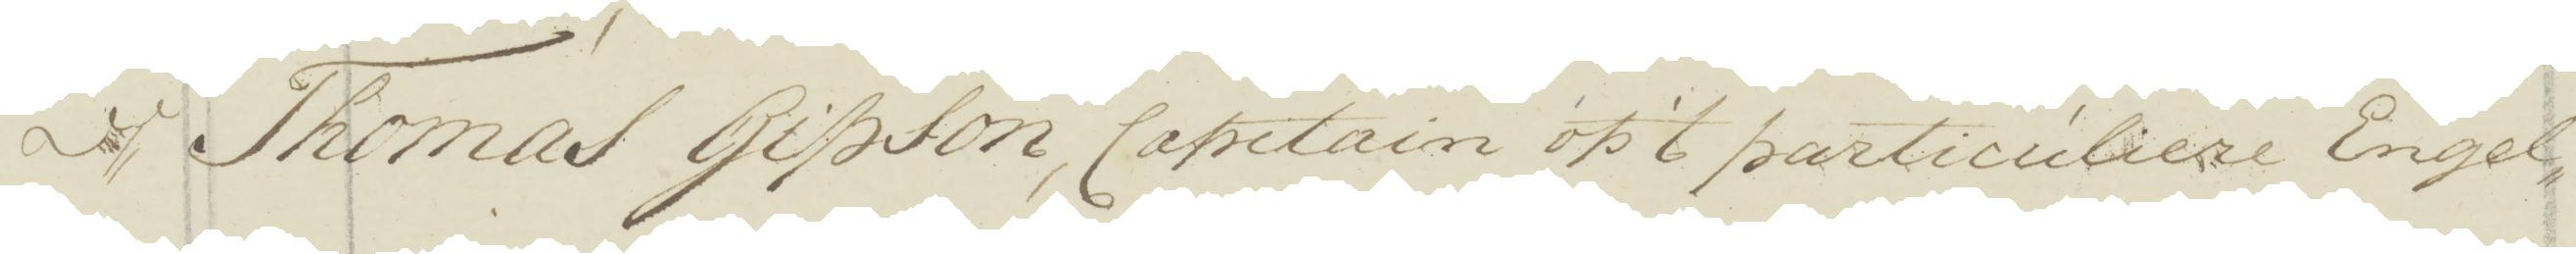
_„ Thomas Gibson, capitain op ’t particuliere Engel„
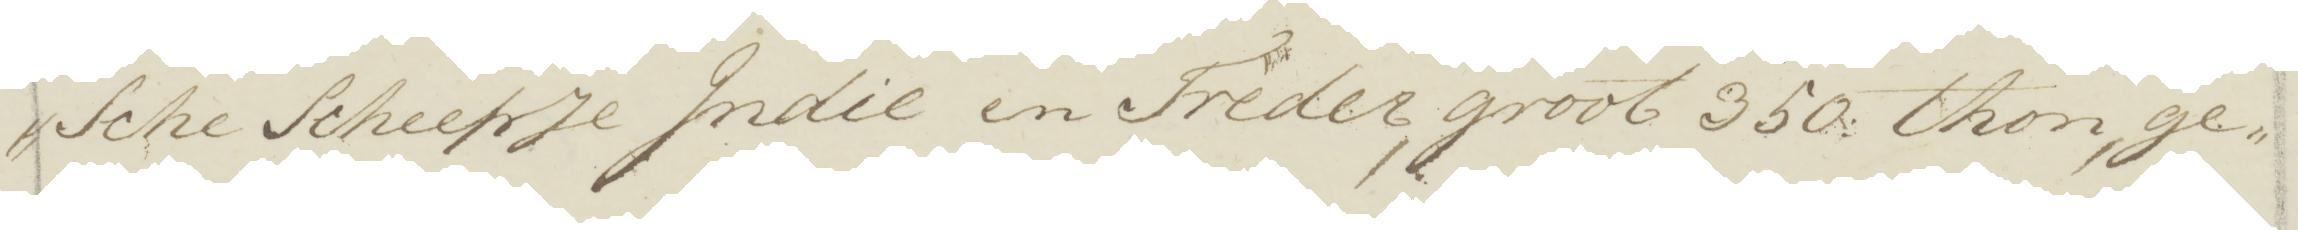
„sche scheepje Jndie en Treder, groot 350: thon, ge„
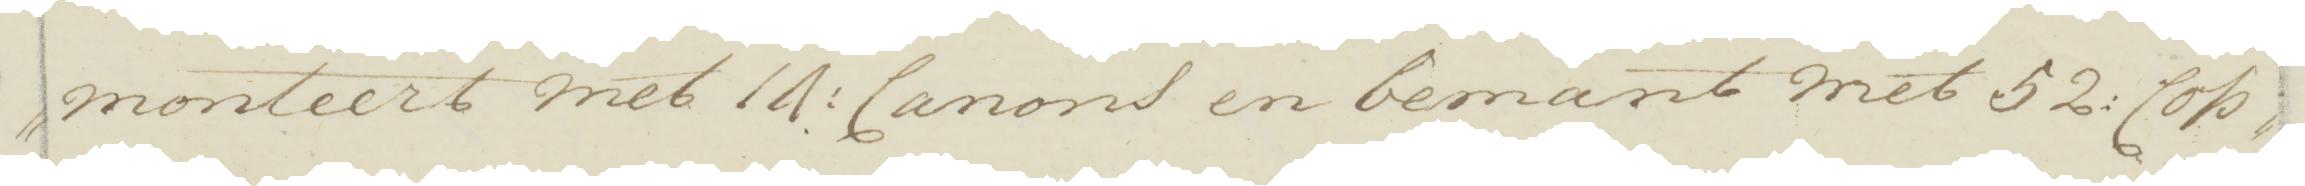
„monteert met 14: canons en bemant met 52: cop„
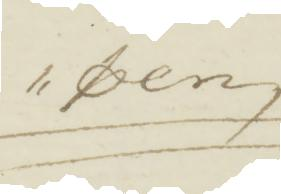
„pen
